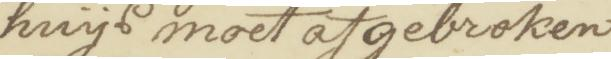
huijs moet afgebroken
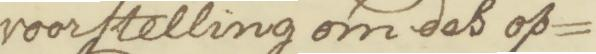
voorstelling om des op=
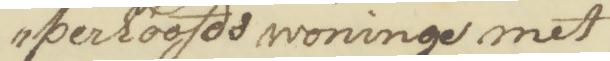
„perhoofds woninge met
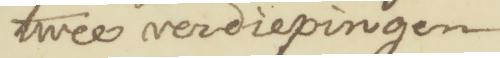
twee verdiepingen
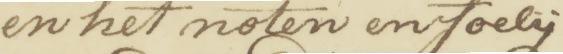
en het noten en foelij
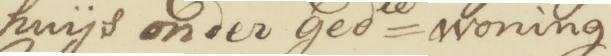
huijs onder ged=te woning
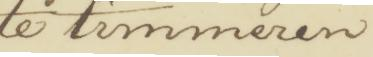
te timmeren
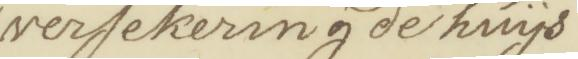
versekering de huijs
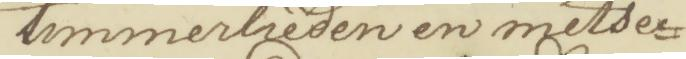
timmerlieden en metse=
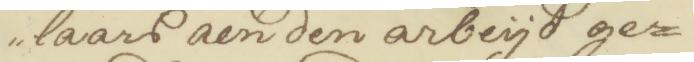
„laars aen den arbeijd ge=
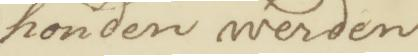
houden werden
